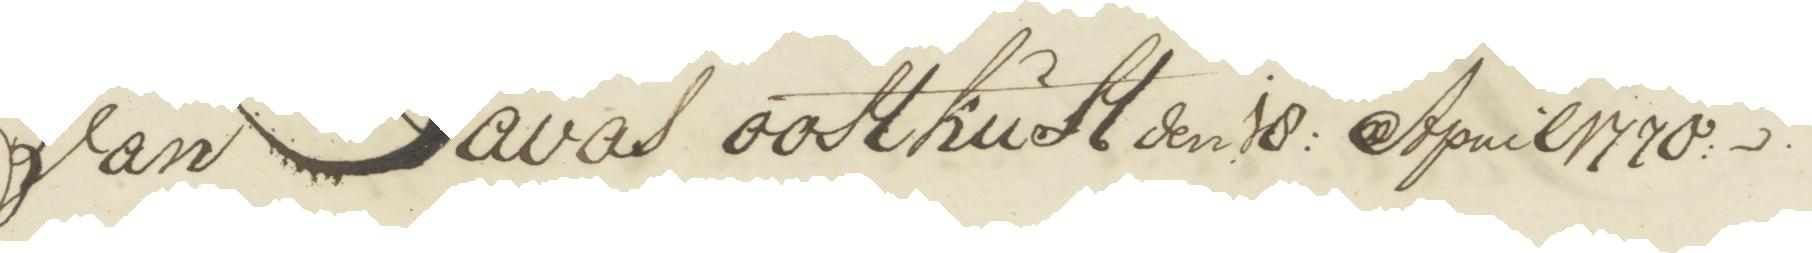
Van Javas oost kust den 18: April 1770:—.
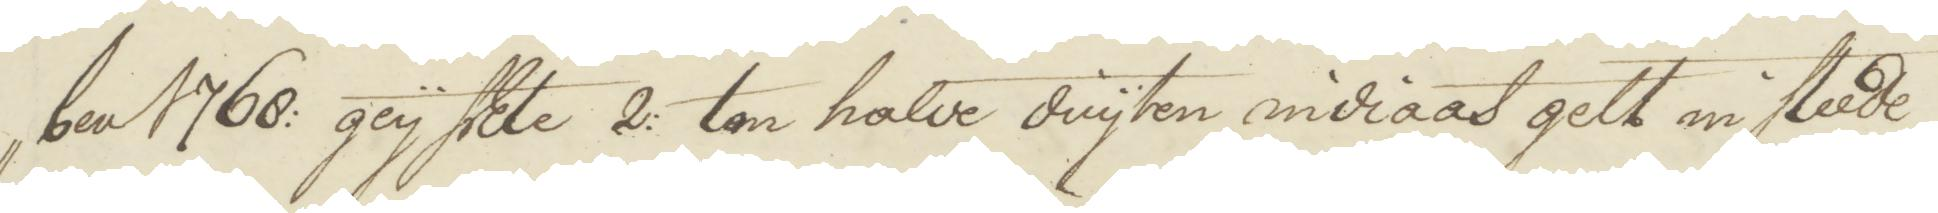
„ber 1768: geijschte 2: ten halve duijten indiaas gelt in steede
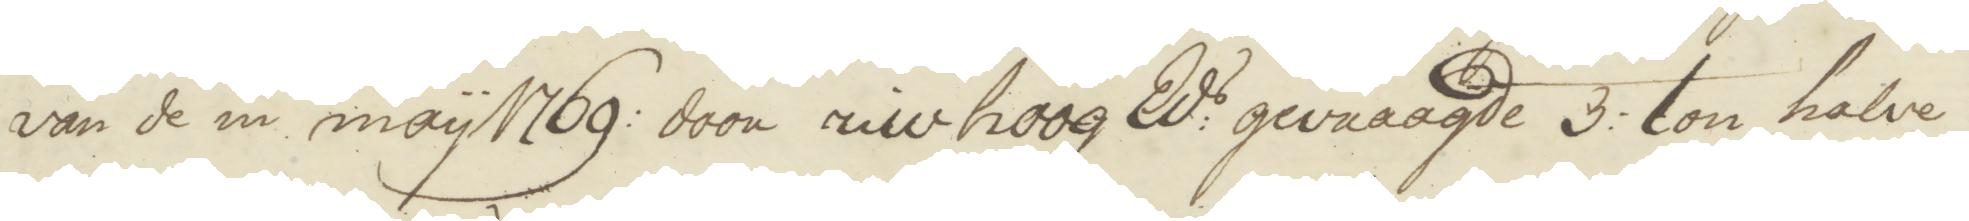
van de in maij 1769: door uw hoog Ed:s gevraagde 3: ton halve
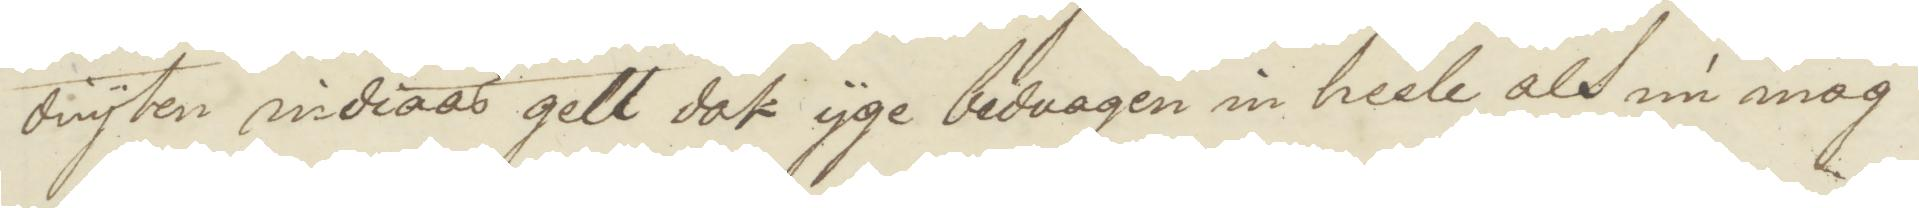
duijten indiaas gelt dat ijge bedragen in heele als nu mag
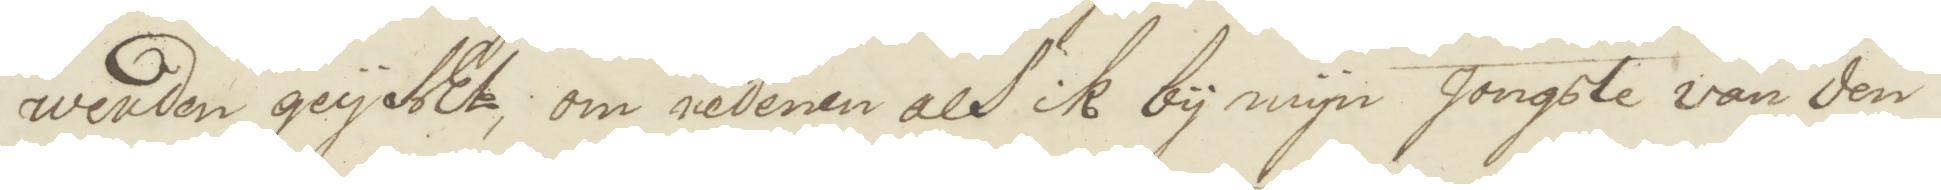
werden geijscht, om redenen als ik bij mijn jongste van den
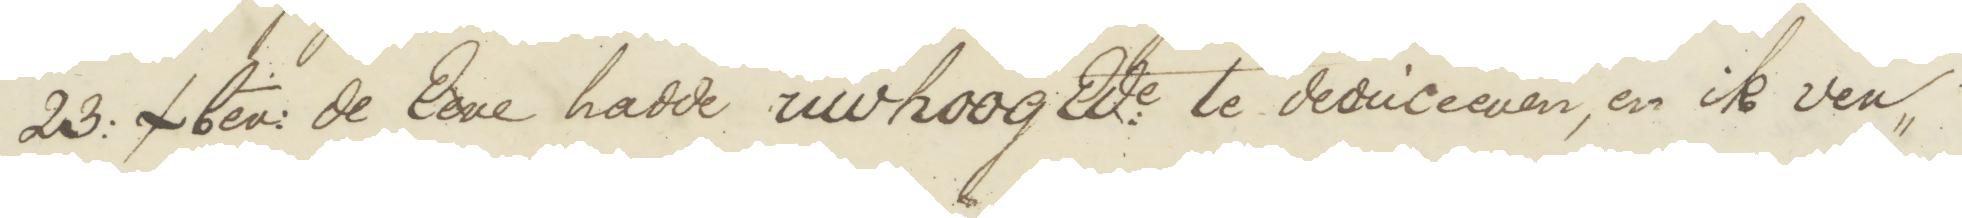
23: xber: de Eere hadde uw hoog Ed:e te deduceeren, en ik ver„
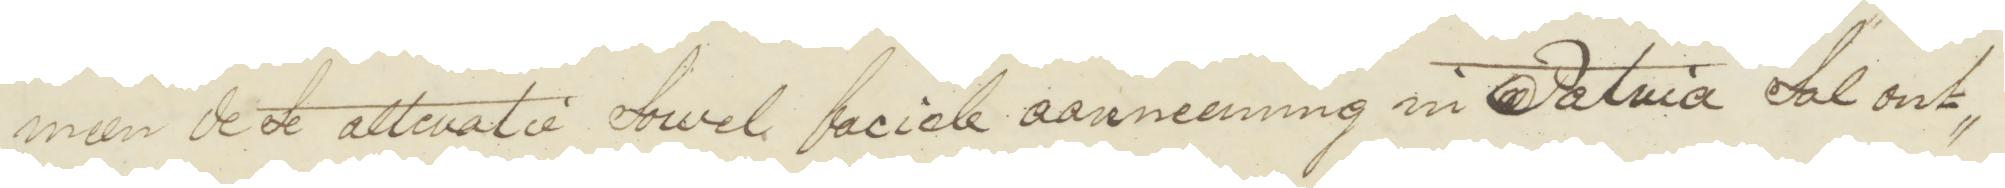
meen dese alteratie sowel faciele aanneeming in Patria sal ont„
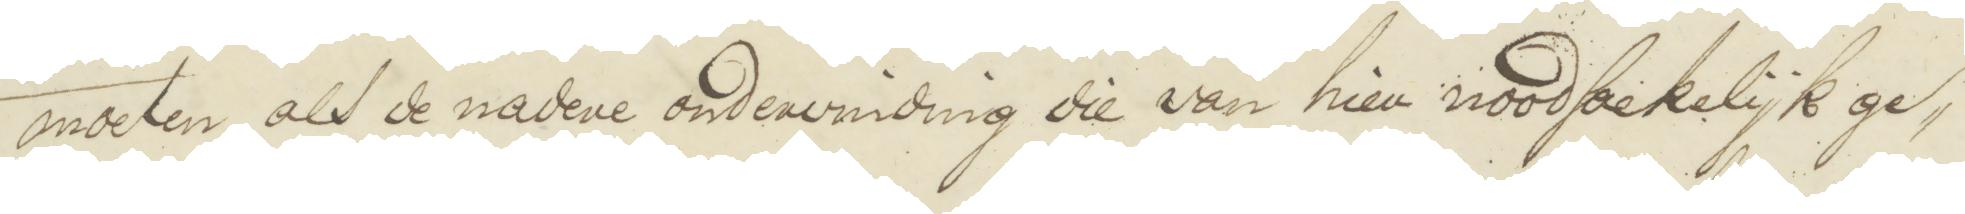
moeten, als de nadere ondervinding die van hier noodsaekelijk ge„
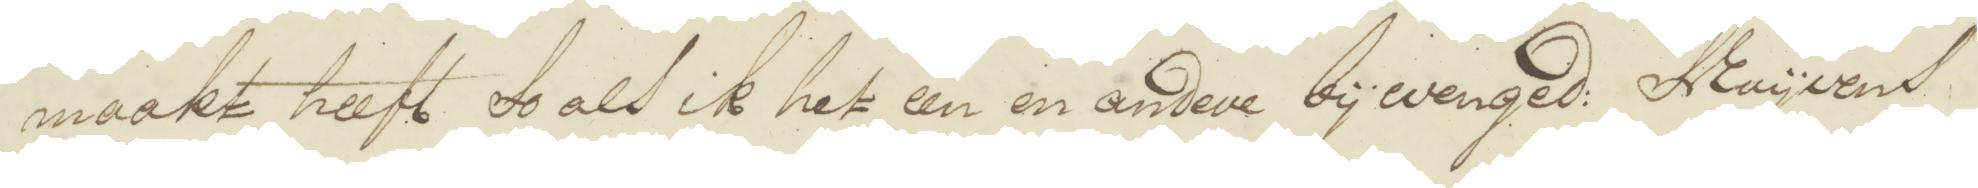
maakt heeft so als ik het een en andere bij evenged: schrijvens
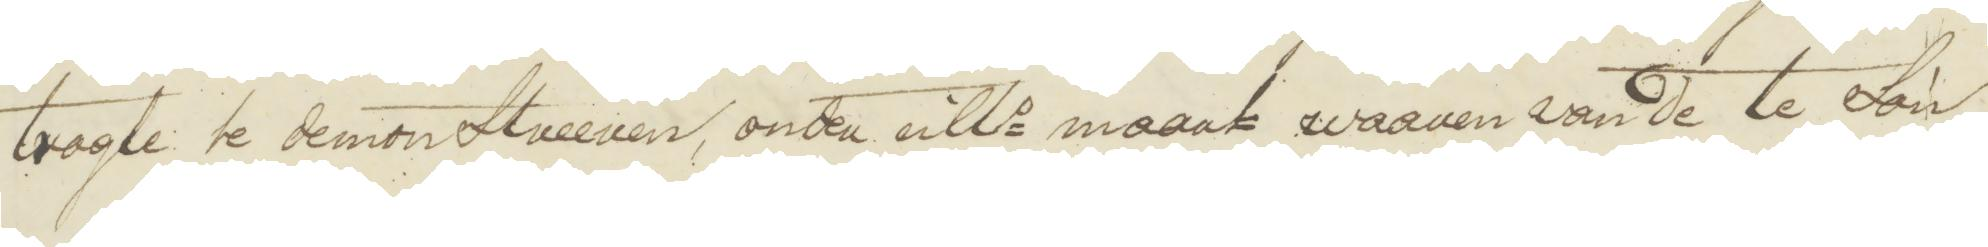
tragte te demonstreeren, onder ult=o maart waaren van de te sou
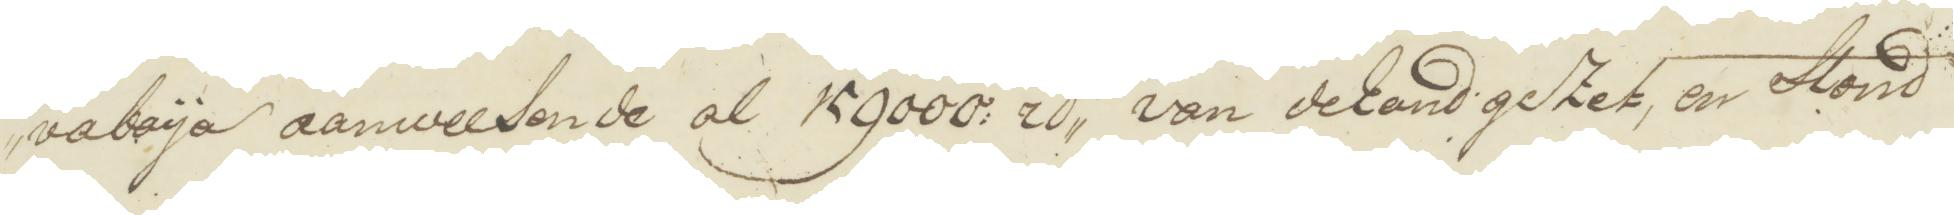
rabaija aanweesende al 159000: rd=s van dehand gezet, en stond
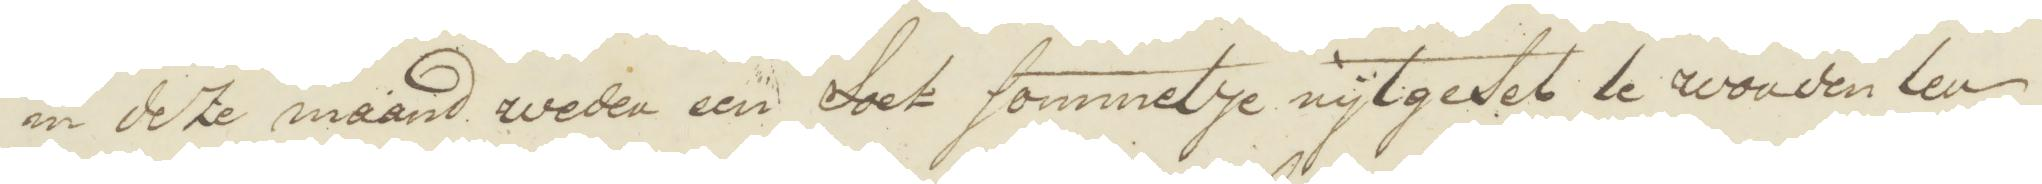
in deze maand weder een soet sommetje uijtgeset te worden ter
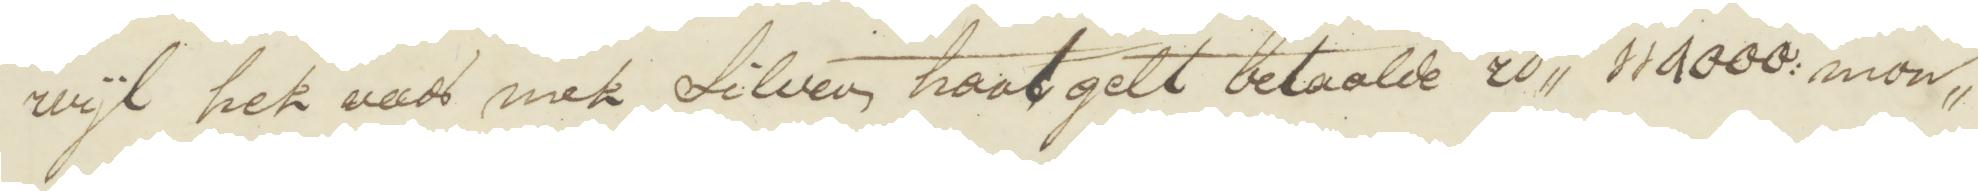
wijl het reeds met silveren haatgelt betaalde rd„s 114000: mon„
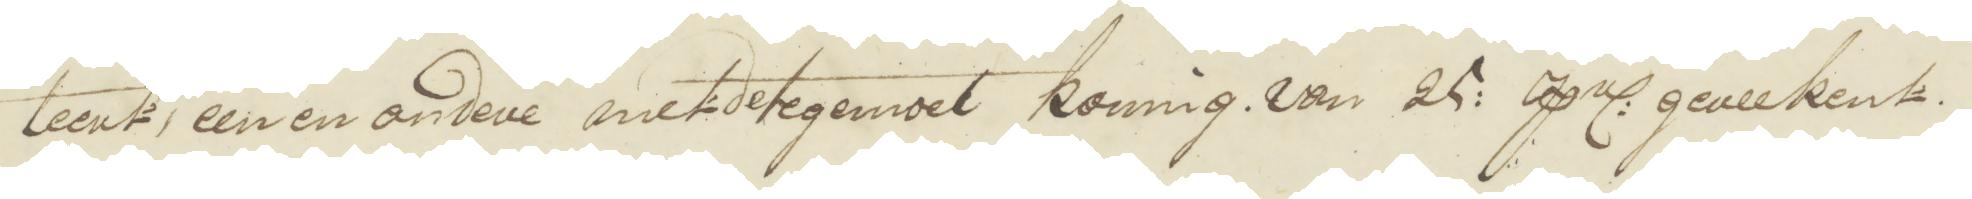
teert, een en andere met de tegemoet koming van 25: prc: gereekent.
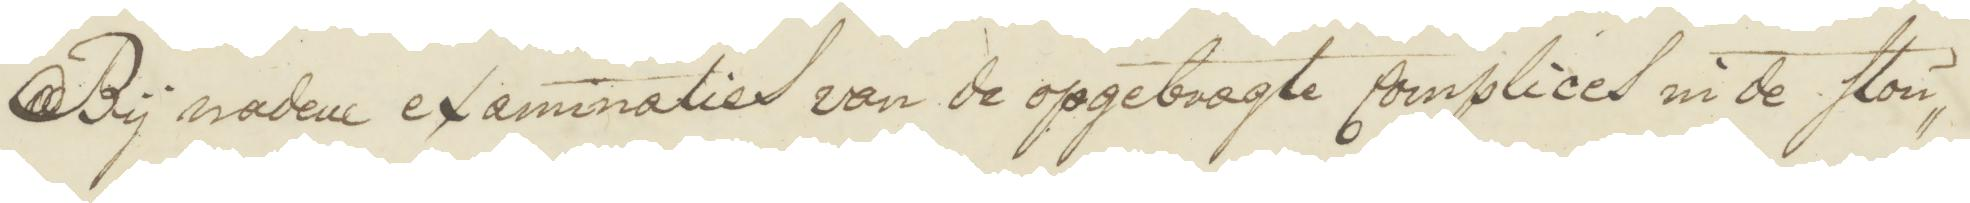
Bij nadere examinaties van de opgebragte complices in de stou„
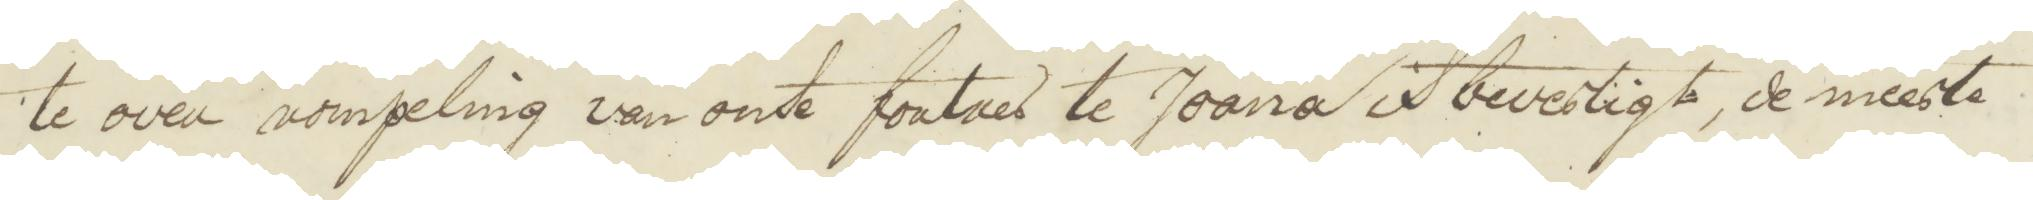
te over rompeling van onse fortres te Joana is bevestigt, de meeste
